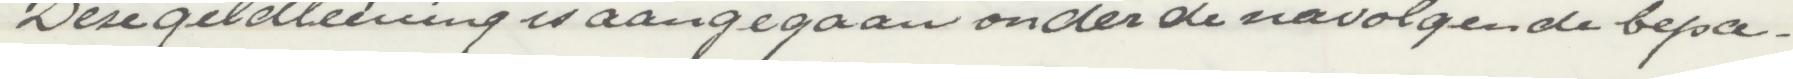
Deze geldleening is aangegaan onder de navolgende bepa-
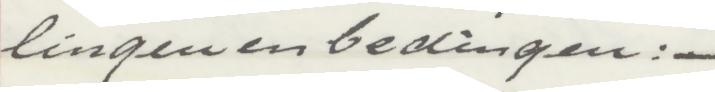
lingen en bedingen:—
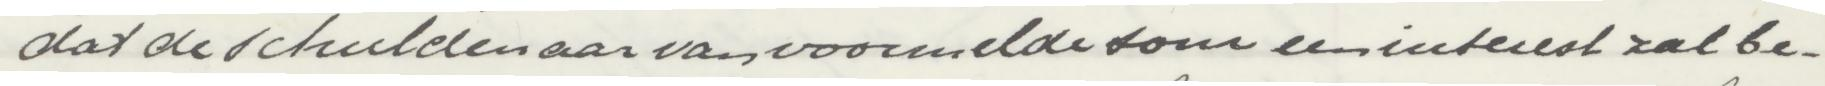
dat de schuldenaar van voormelde som een interest zal be„
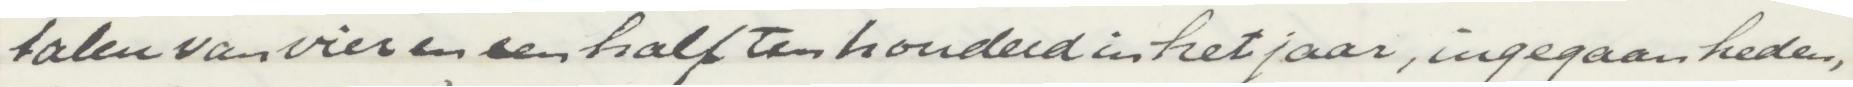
talen van vier en een half ten honderd in het jaar, ingegaan heden,
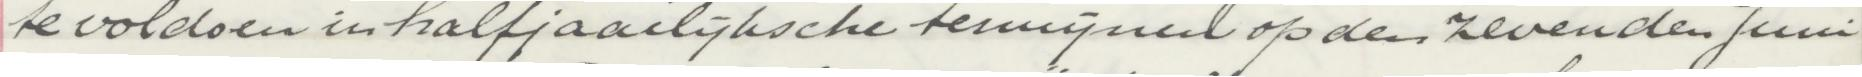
te voldoen in halfjaarlijksche temijnen op den zevenden Juni
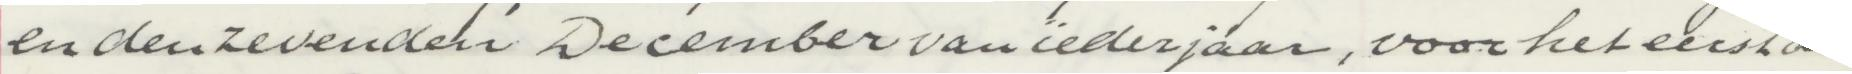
en den zevenden December van ieder jaar, voor het eerst de
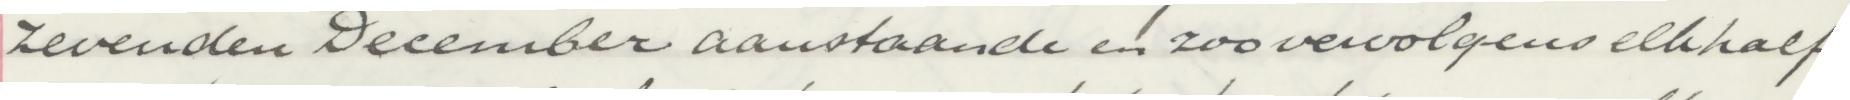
Zevenden December aanstaande en zoo vervolgens elk half
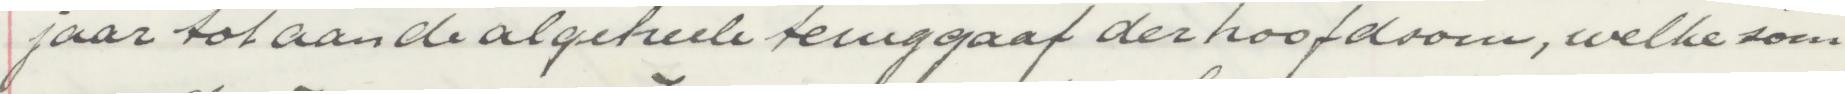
jaar tot aan de algeheele teruggaaf der hoofdsom, welke som
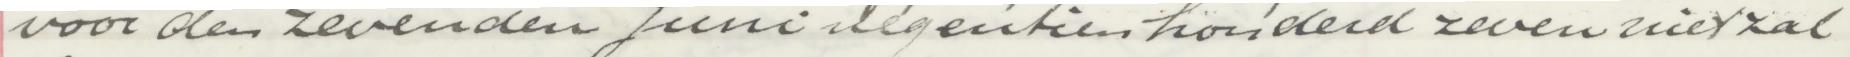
voor den zevenden Juni negentien honderd zeven niet zal
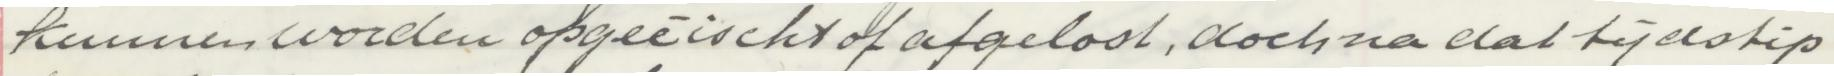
kunnen worden opgeeischt of afgelost, doch na dat tijdstip
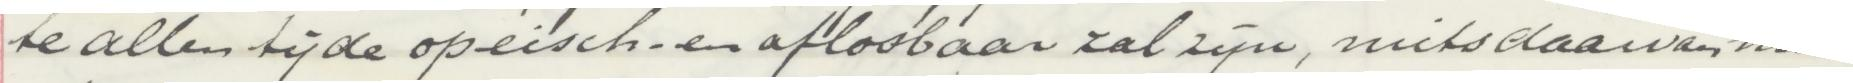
te allen tijde opeisch- en aflosbaar zal zijn, mits daarvan min
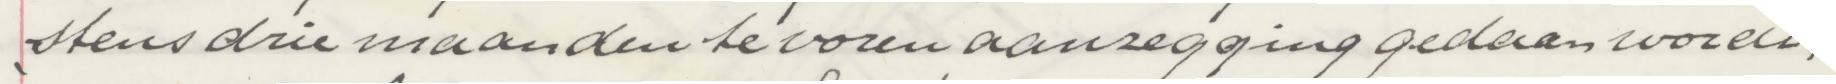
stens drie maanden te voren aanzegging gedaan wordt;
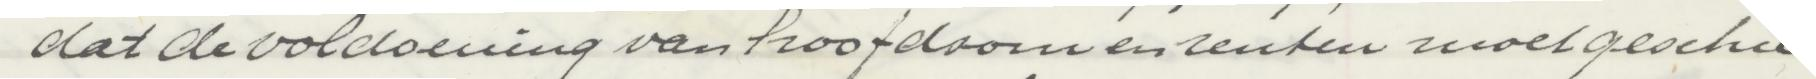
dat de voldoening van hoofdsom en renten moet geschie
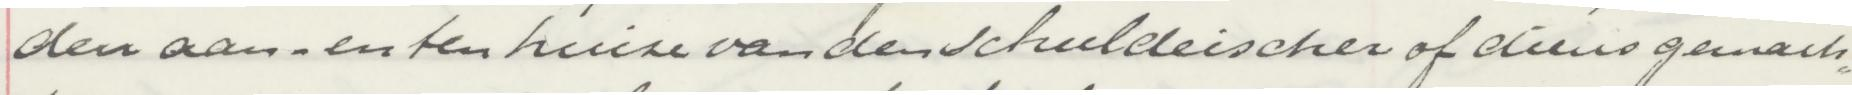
den aan-en ten huize van den schuldeischer of diens gemach„
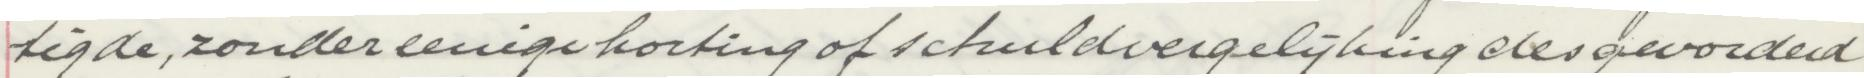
tigde, zonder eenige korting of schuldvergelijking des gevorderd
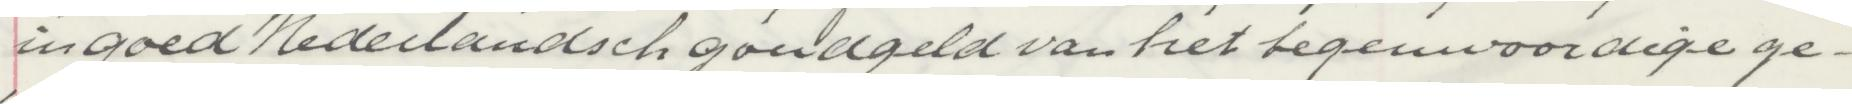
En goed Nedellandsch goudgeld van het tegenwoordige ge-
